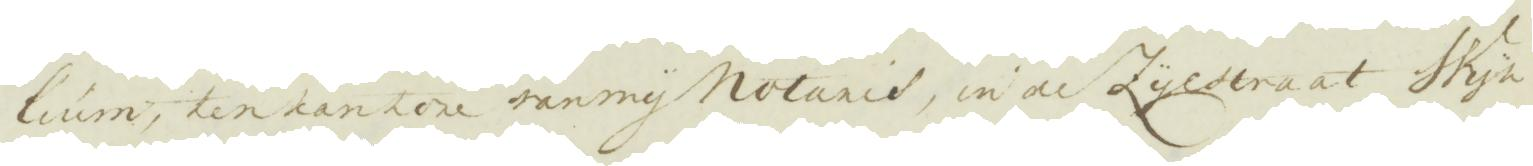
lium, ten kantore vanmij notaris, in de Zijlstraat Wijk
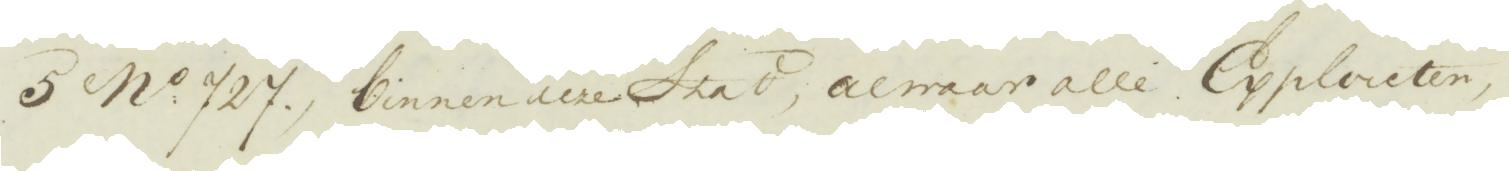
5 n:o 727., binnen deze Stad, alwaar alle Exploicten,
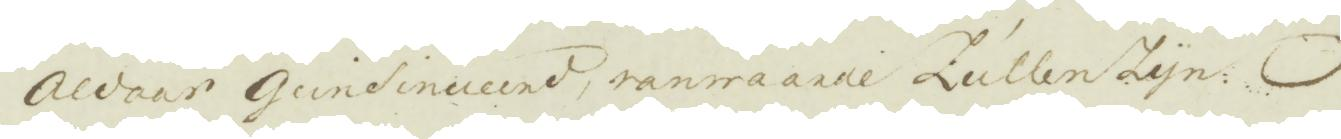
aldaar geinsinueerd, vanwaarde zullen zijn:
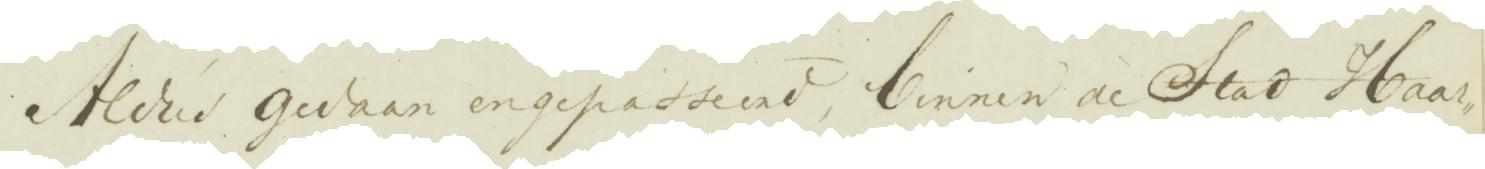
Aldus gedaan en gepasseerd, binnen de Stad Haar„
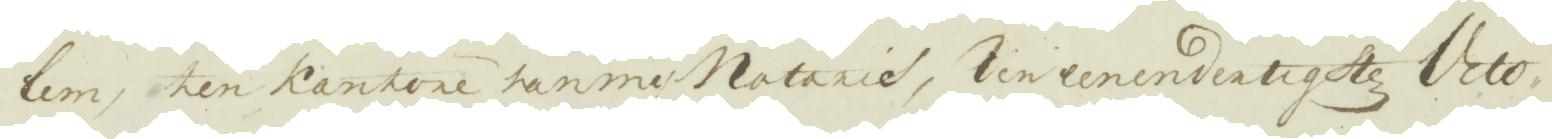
lem, ten kantore vanmij Notaris, den eenendertigsten Octo„
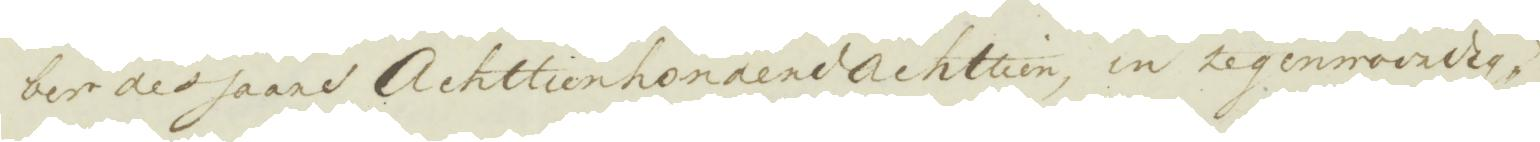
ber des jaars Achttienhonderdachttien, in tegenwoordig„
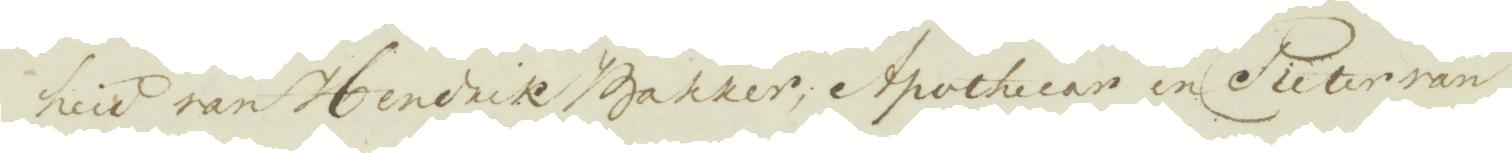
heid van Hendrik Bakker, Apothecar en Pieter van
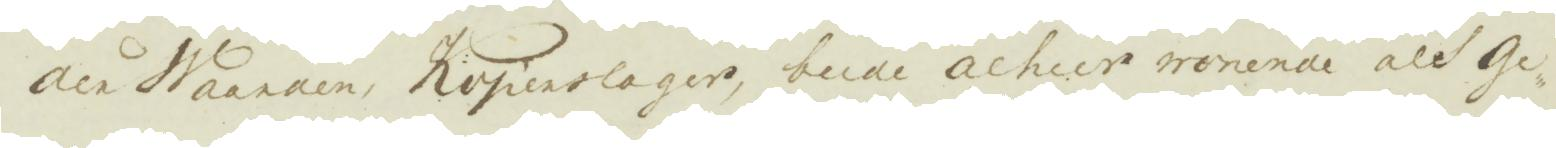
der Waarden, Koperslager, beide alhier wonende als ge„
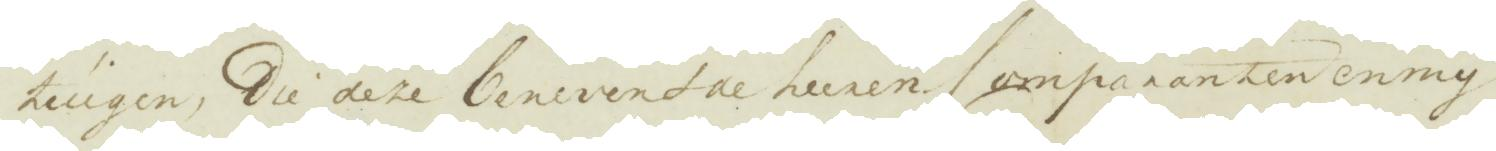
zuigen, die deze benevensde heeren Comparanten en mij
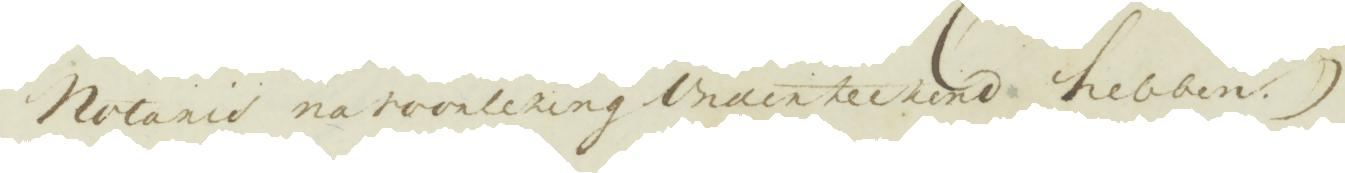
Notaris na voorlezing onderteekend hebben.)
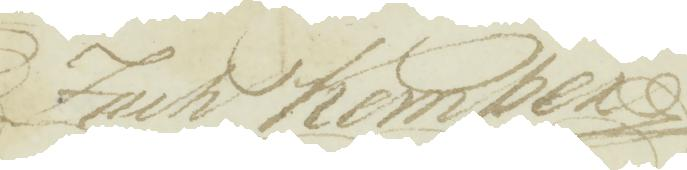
Zach Kemper
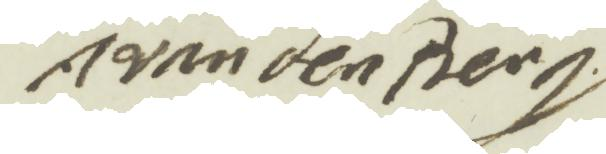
A van den Berg.
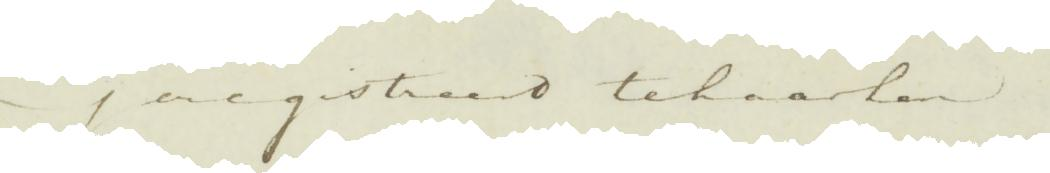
Geregistreerd tehaarlem
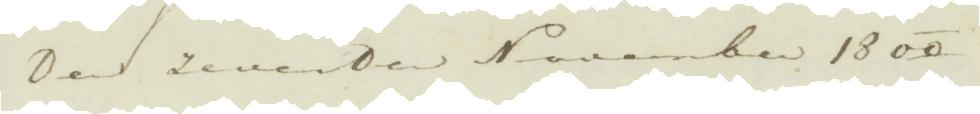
Den zevenden November 1800
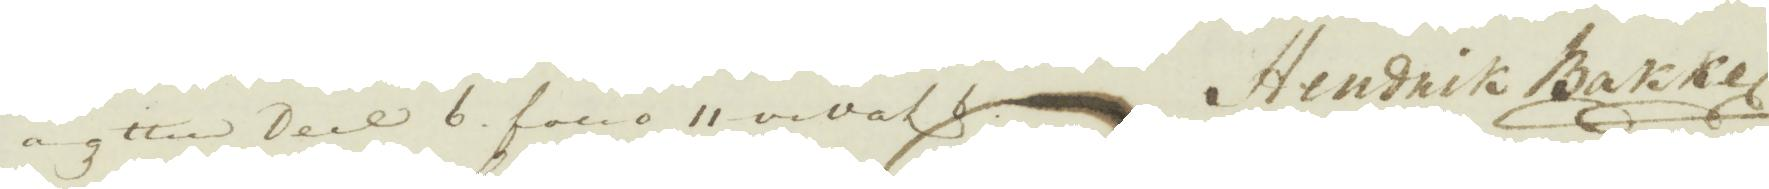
agttien Deel 6. folio 11 ve vak 6. Hendrik Bakker
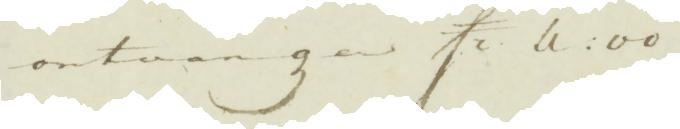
ontvangen fr. 4:00
